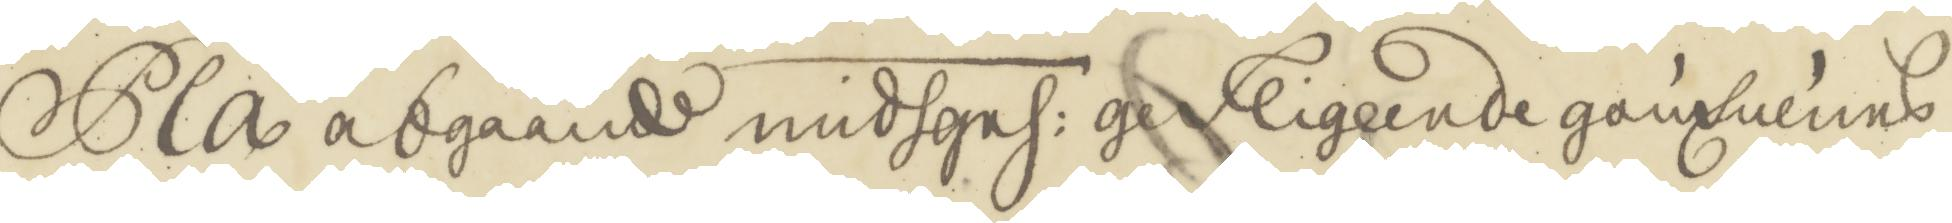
Pla afgaande midsgrs: ge Eligeerde gouverneurs
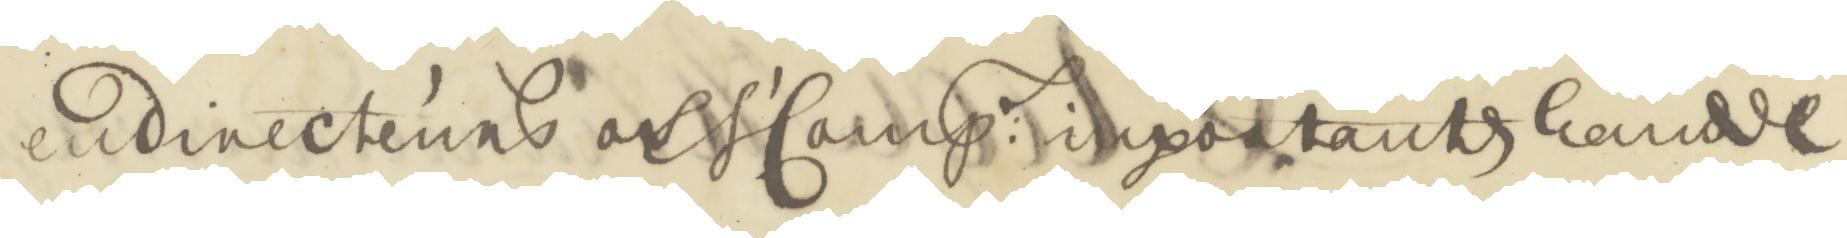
en directeurs over s'Comp:s inpostanten handel
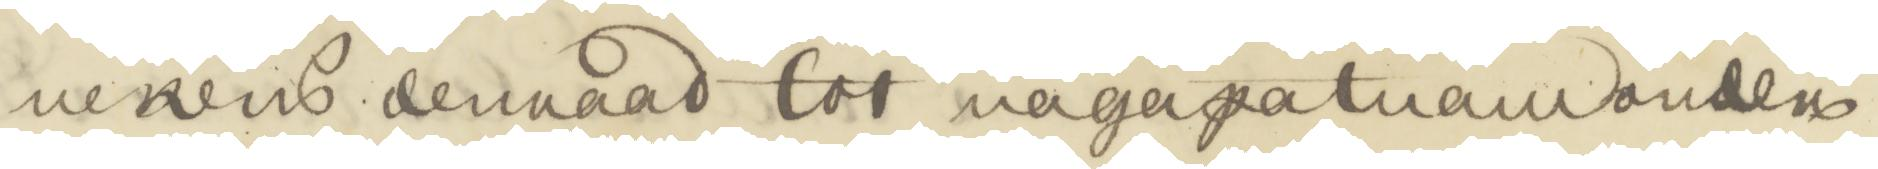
nevens den raad tot nagapatnam onder
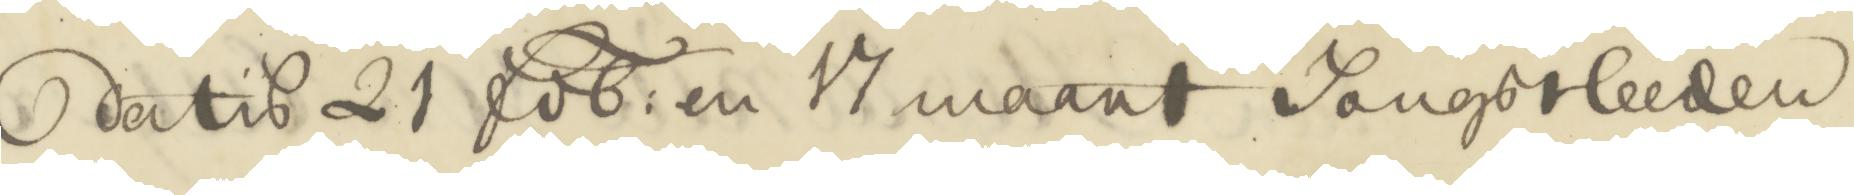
datis 21 Feb: en 17 maart Iongstleeden
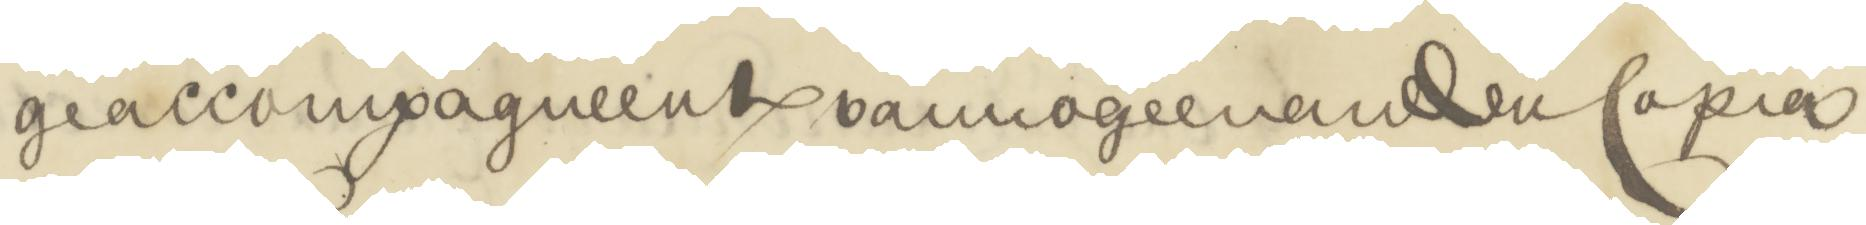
geaccompagneert van nogeenander Copia
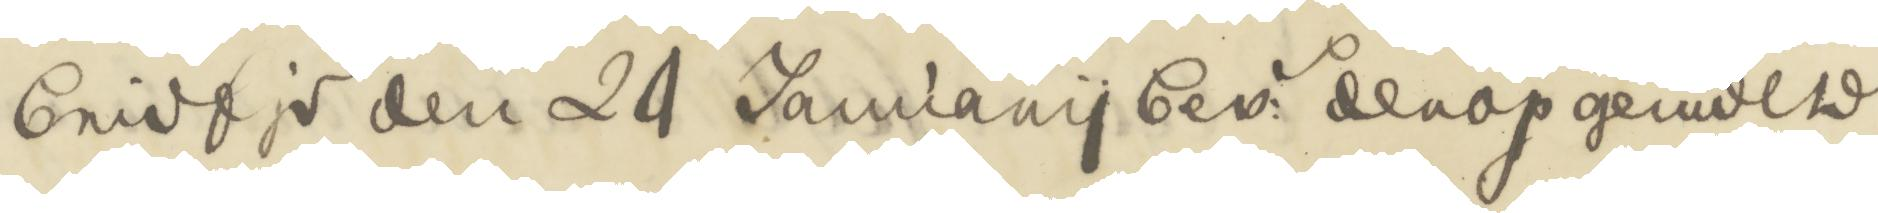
briefje den 24 Ianuarij bev:s der op gemelte
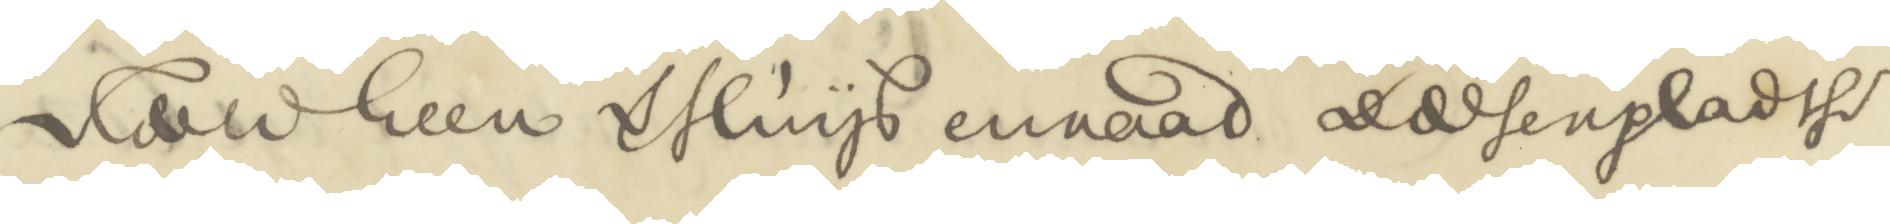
Edele heer Versluijs en raad te deser plaetse
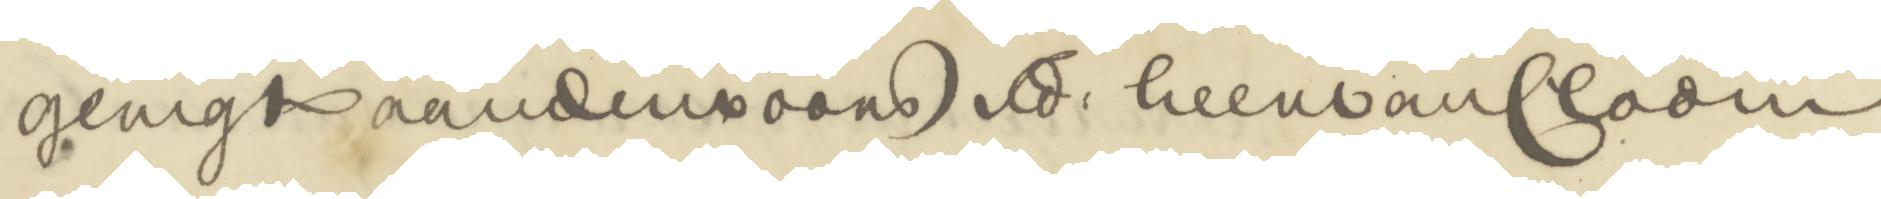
gerigt aandenvoors Ed: heervan Cloom
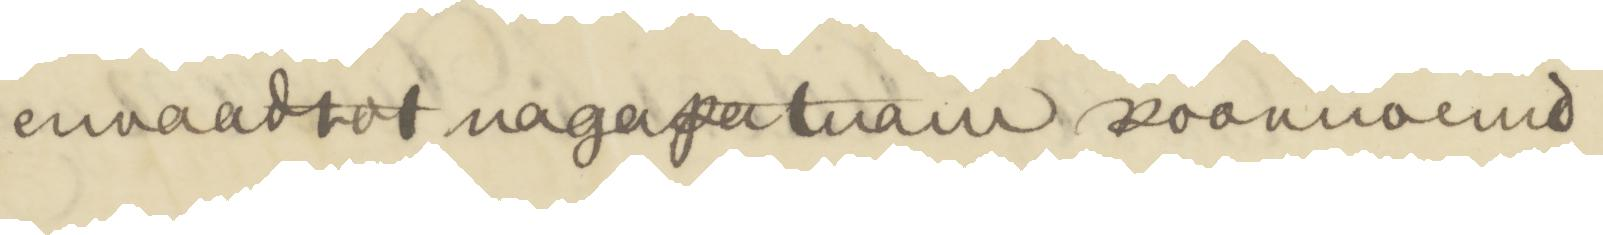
en raad tot nagapatnam voornoemd
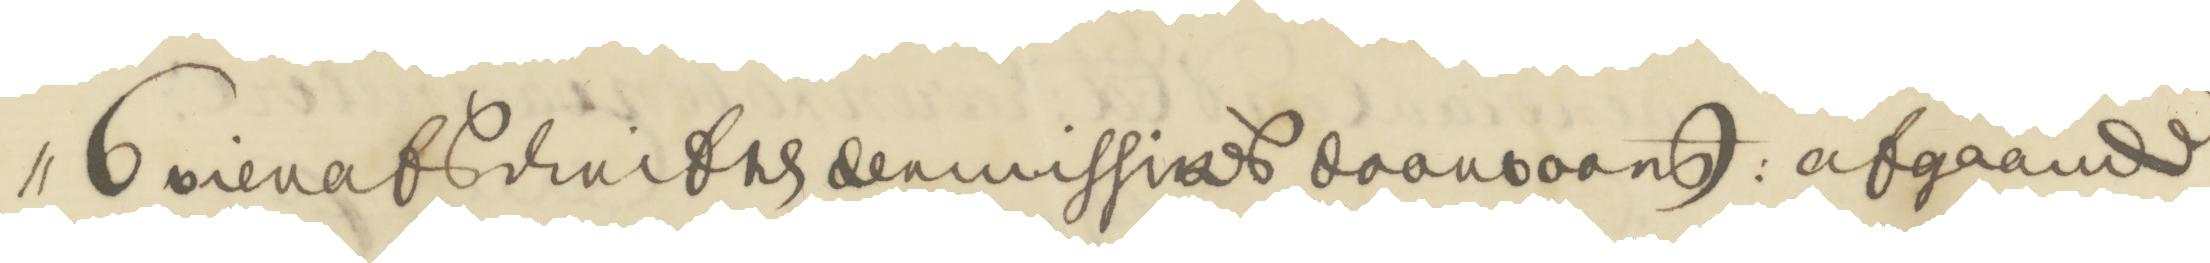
„ 6 vier afschriften dermissives doorvoors: afgaande
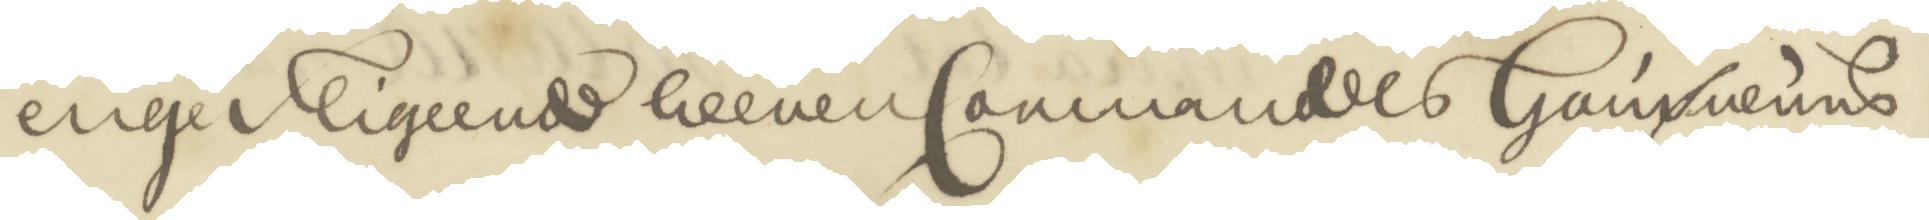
en ge Eligeerde heeren Commandels Gouverneurs
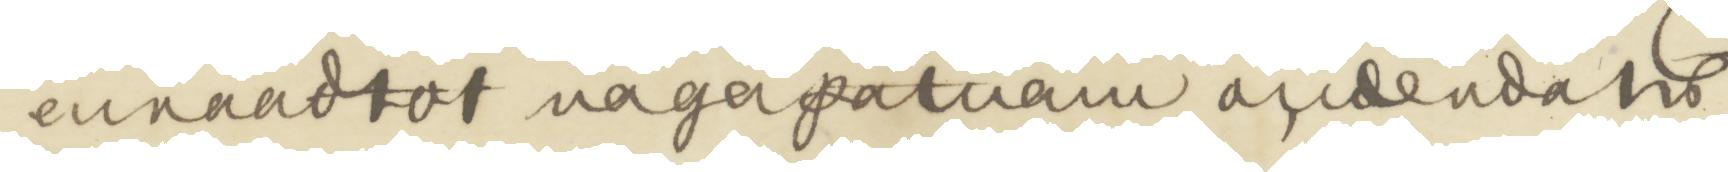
en raad tot nagapatnam onder datis
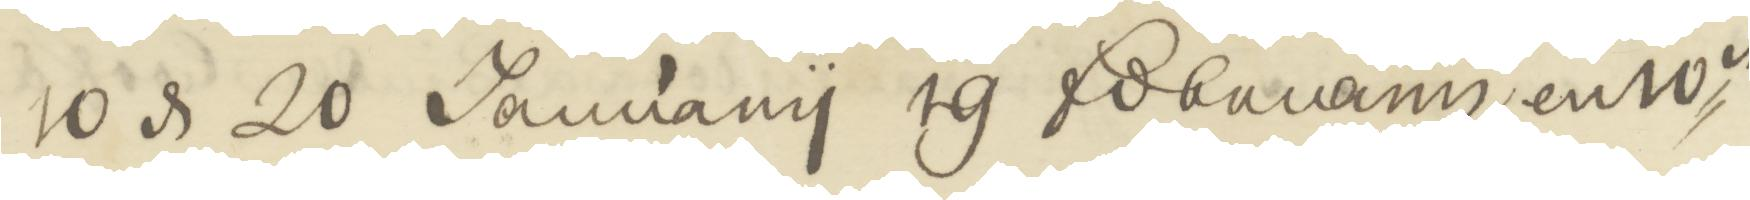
10 en 20 Ianuarij 19 februarij, en 10„en
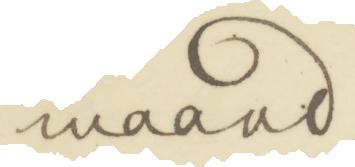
maard
